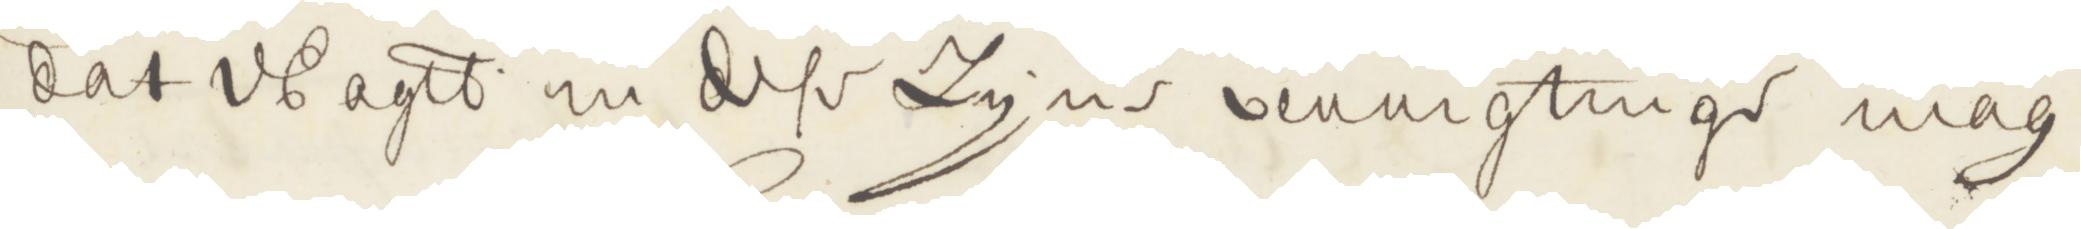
dat UE agtb. in dese zijne verrigtinge mag
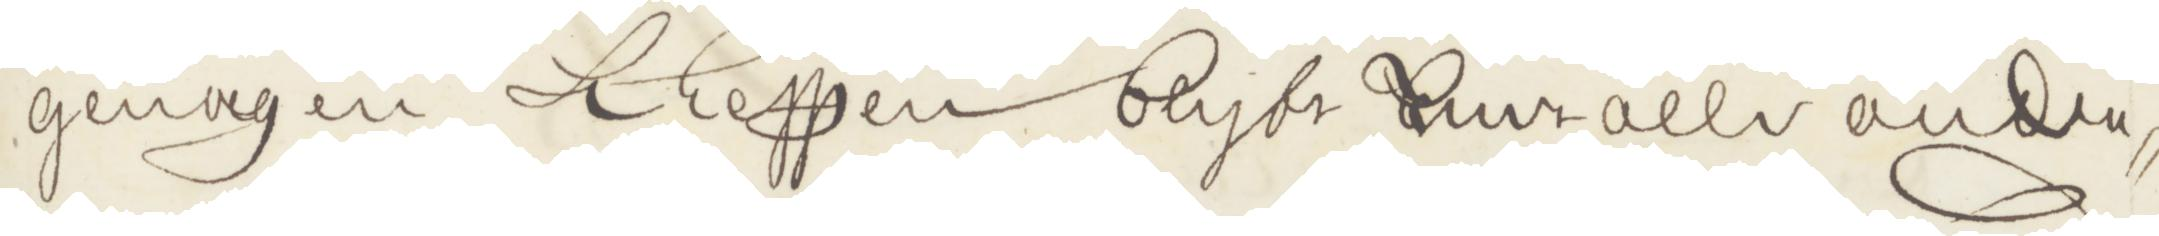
genoegen scheppen blijft met alle onder
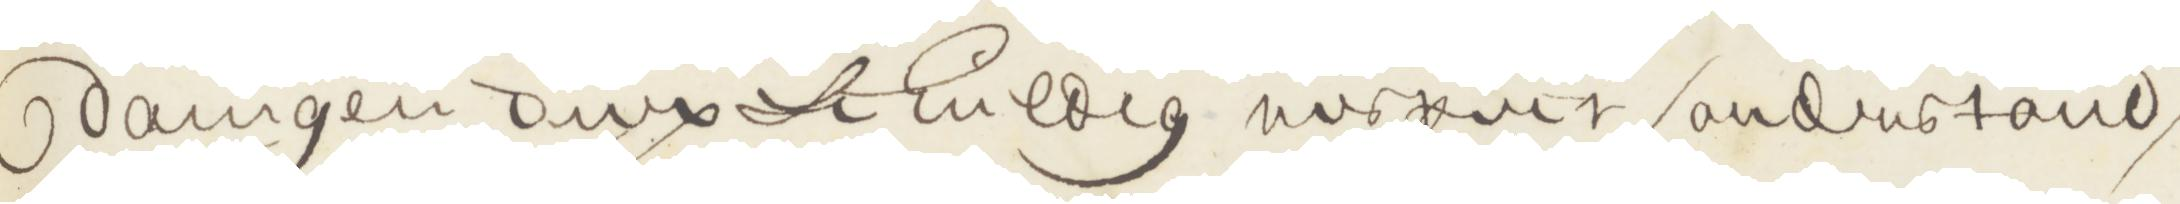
danigen diep schuldig respect /onderstond
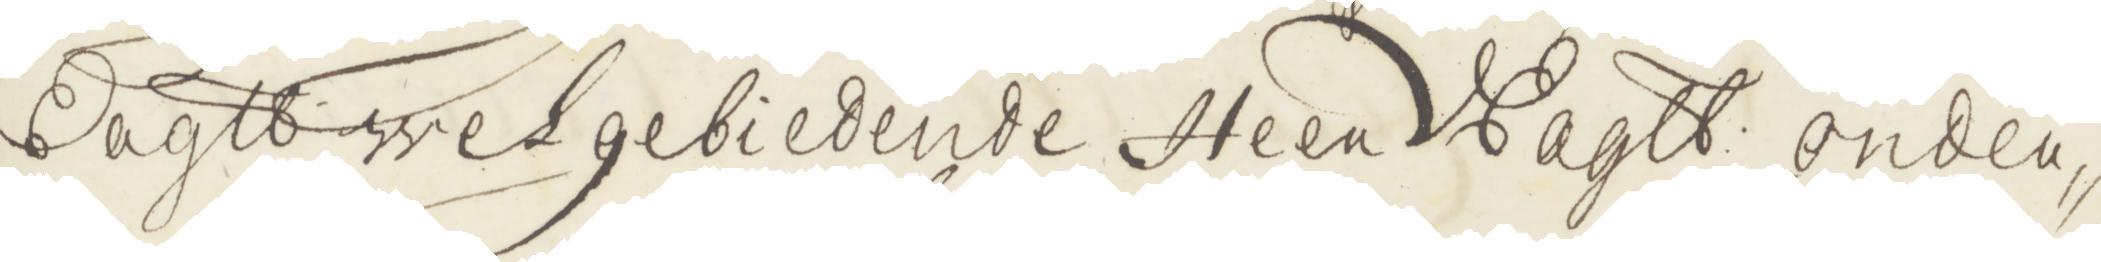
E agtb wel gebiedende Heer VE agtb: onder„
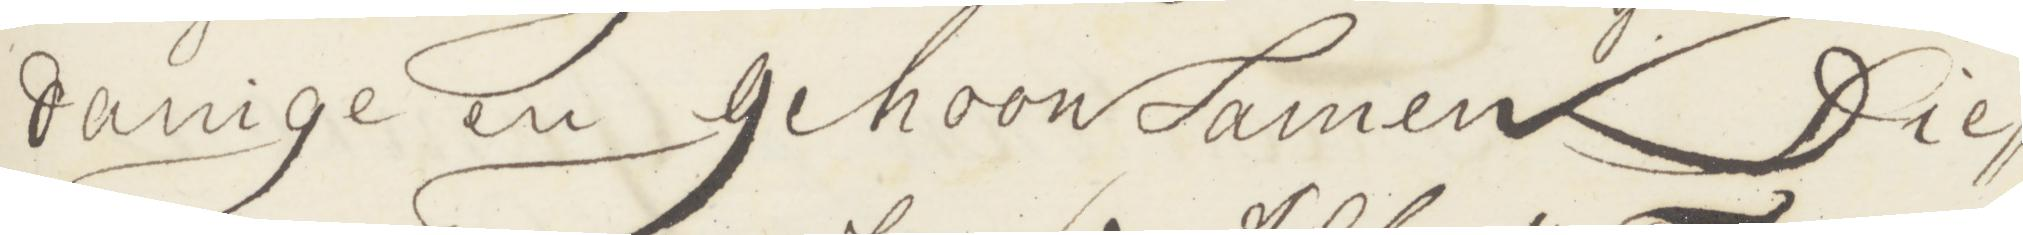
danige en gehoorsamen Die
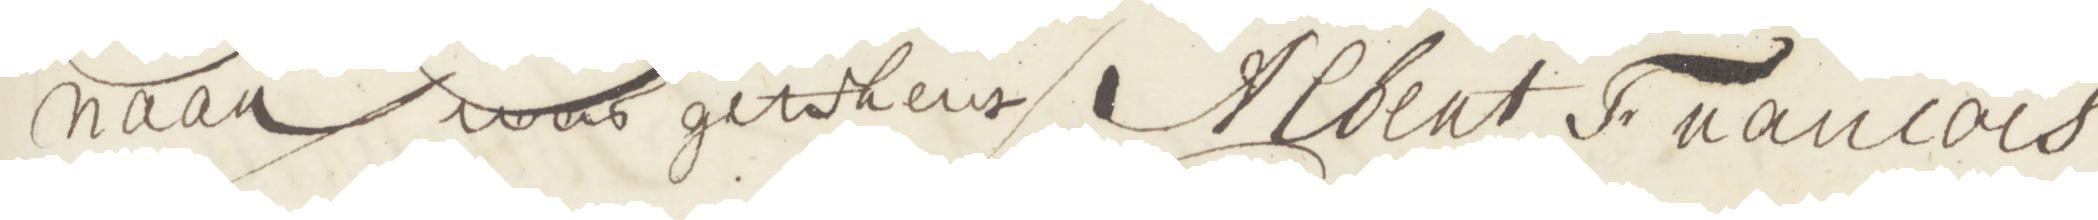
naar was getekent / Albert Francois
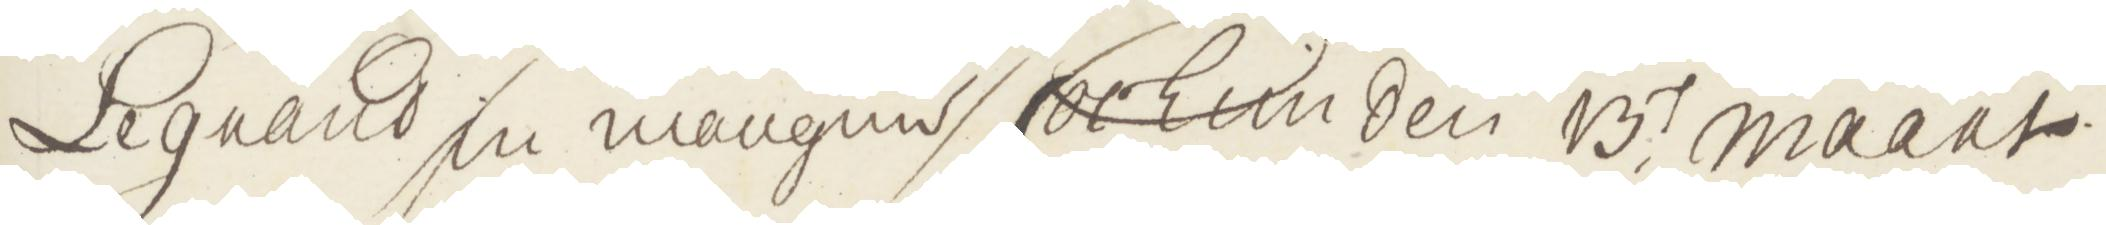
Legrand /in mangine/ Cochim den 13,en maart
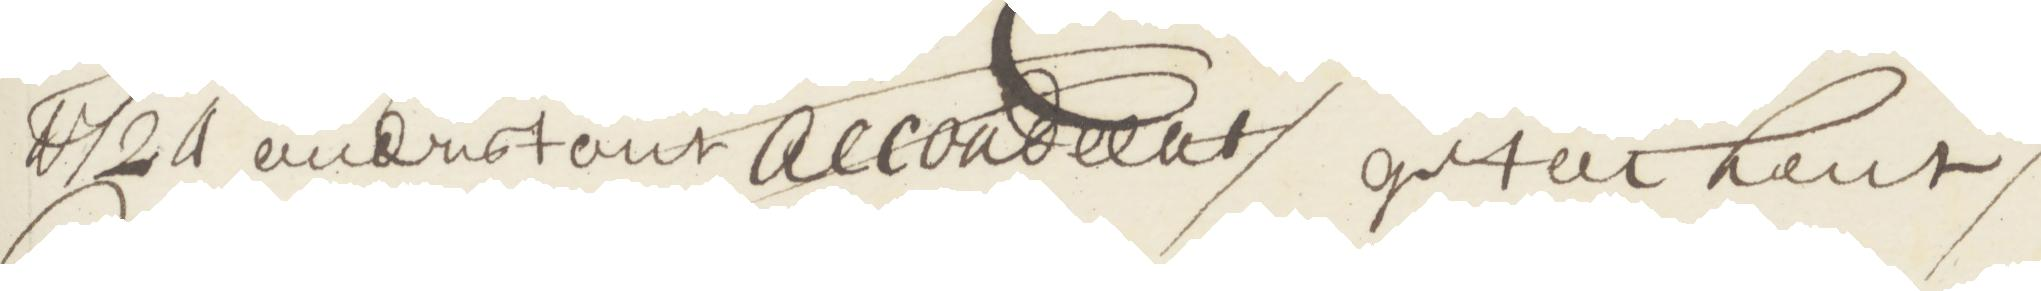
1724 onderstont accordeert/ geteeckent /
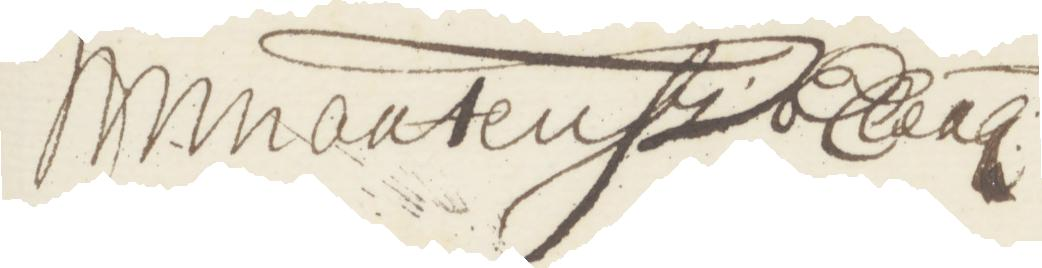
M.martensz EClerq:
